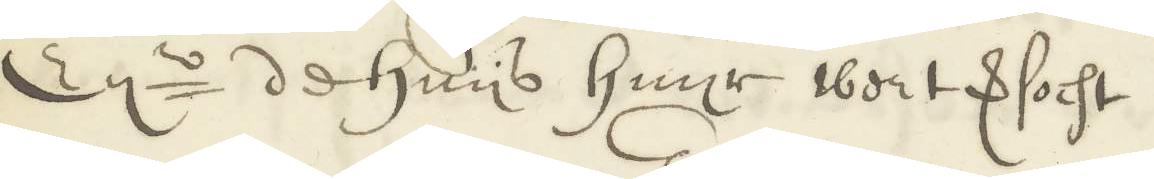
Ey=r de huijs huyr wert versocht
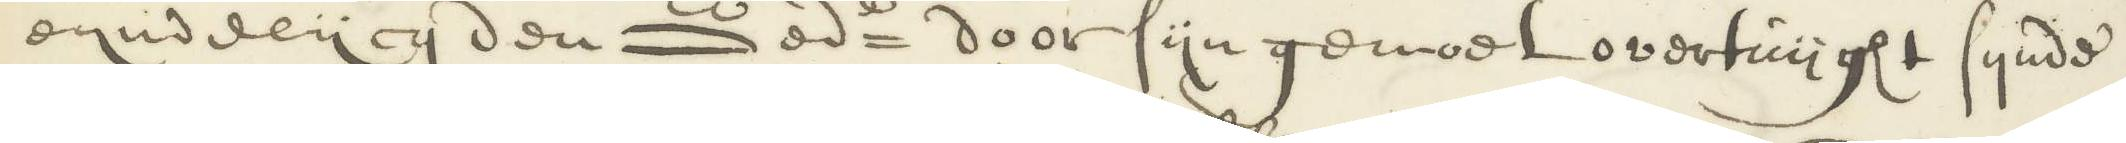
eyndelijcq den Ged=e door sijn gemoet overtuijght synde
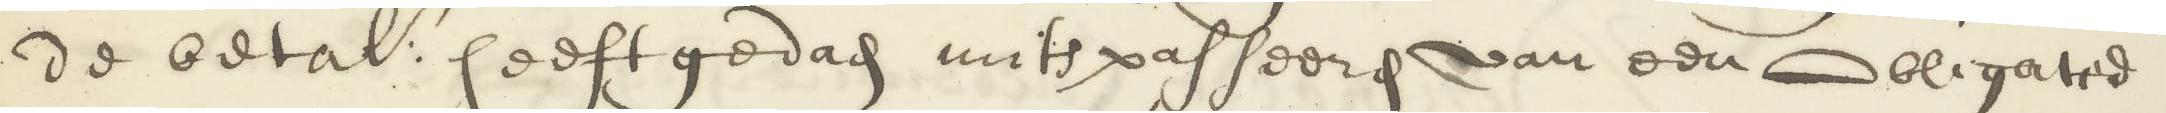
de betal: heeft gedaen mits passeeren van den Obligatie
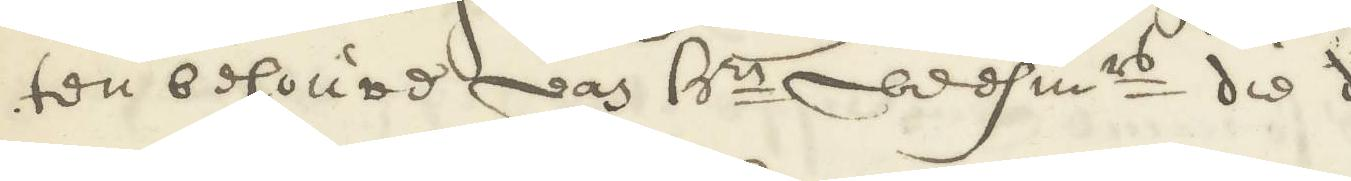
ten behouve van h=r weesm=rs die den Ey:r daer voor hebben
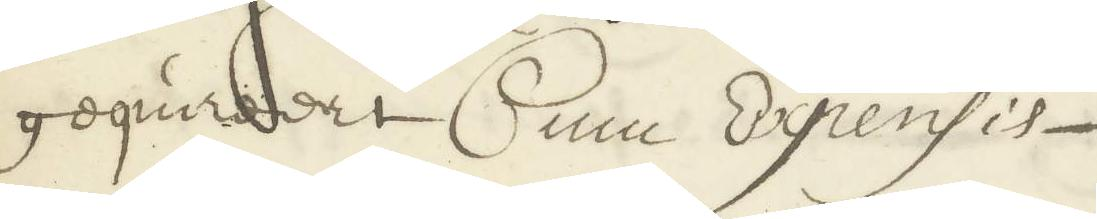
gequireert Cum Expensis
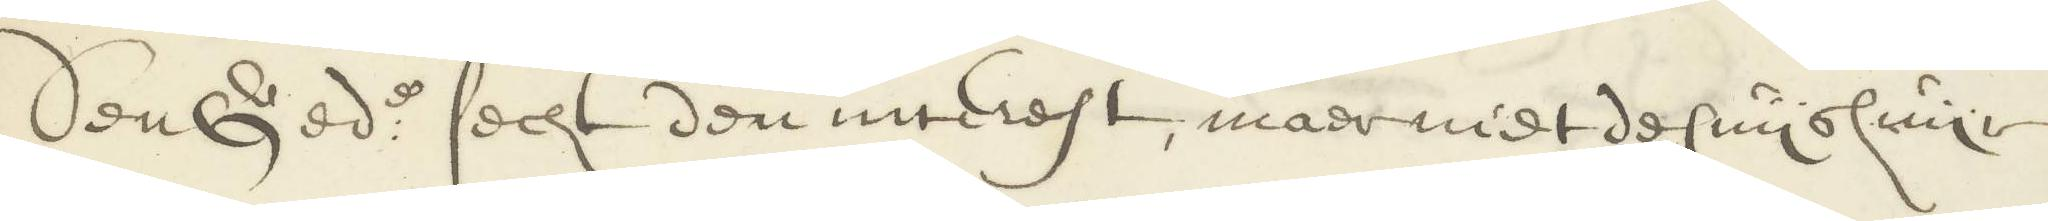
Den Ged:e secht den interest, maer niet de huijshuijr
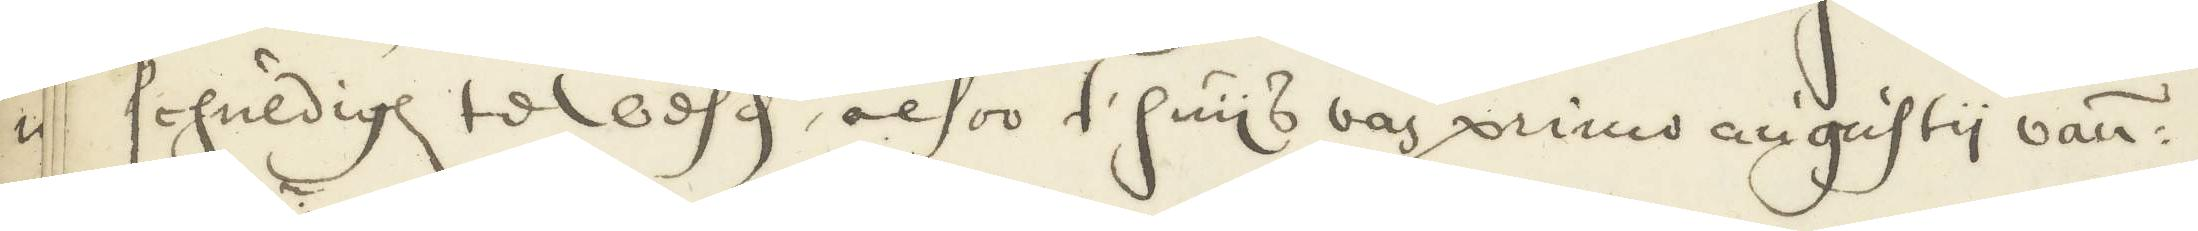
schuldigh te wesen, alsoo 't huijs van primo augustij van:
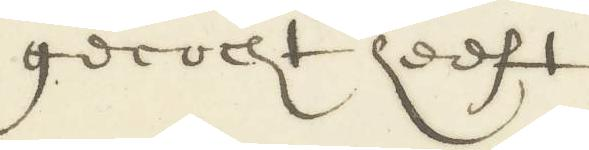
Ey:r gecocht heeft
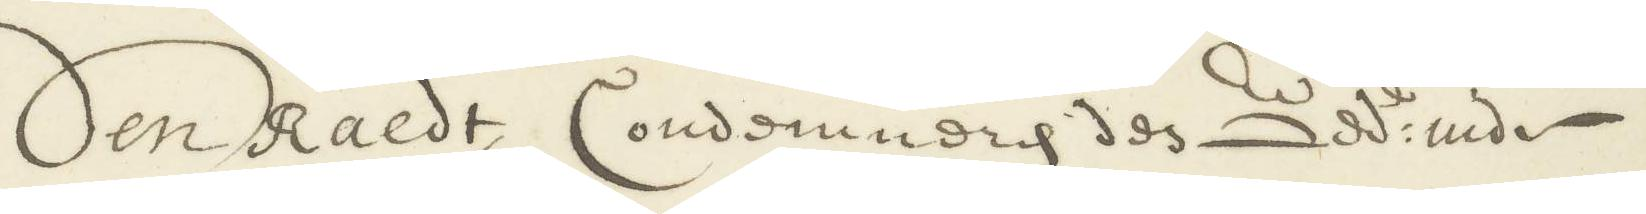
Den Raedt, Condemneren den Ged:e inde
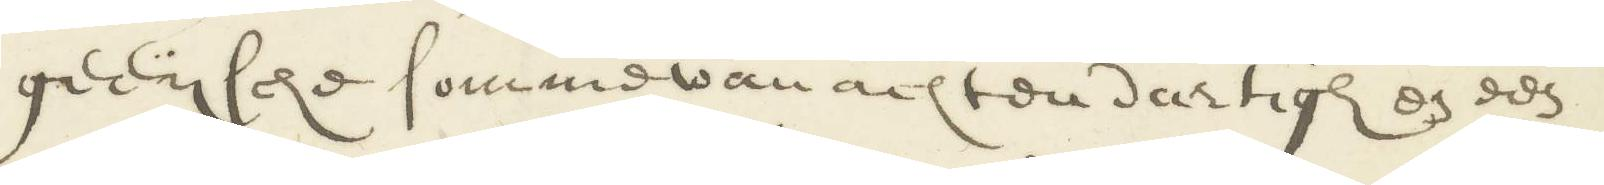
geeijsche somme van achten dartigh en een
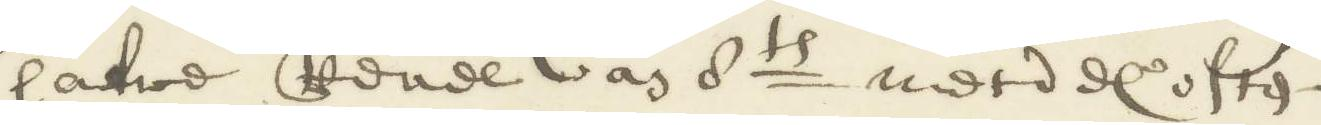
halve Reael van 8=ten met de Costen
